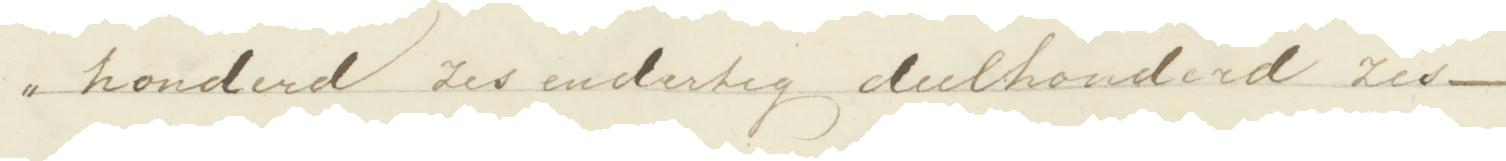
„honderd zes endertig deelhonderd zes —
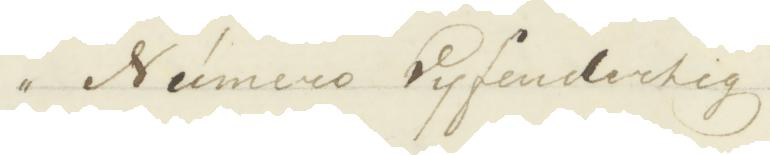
„ Numero vyfendertig
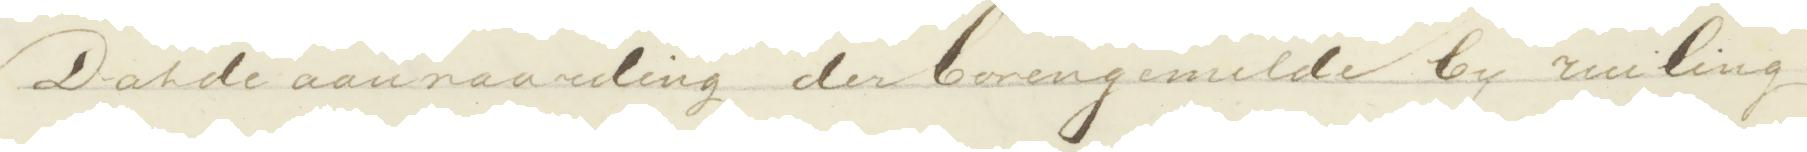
Dat de aanvaarding der bovengemelde by ruiling
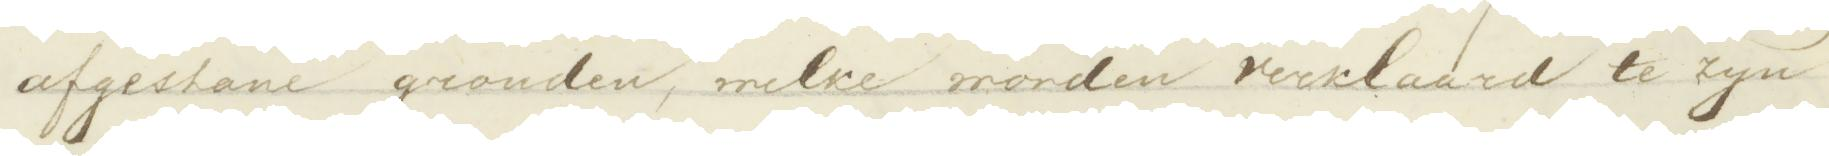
afgestane gronden, welke worden verklaard te zyn
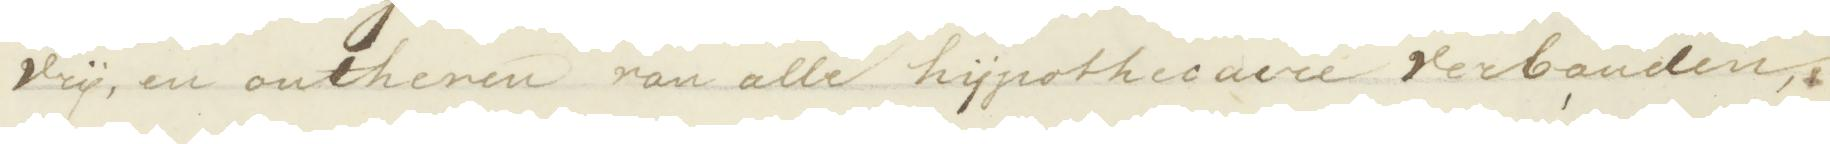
Vrij, en ontheven van alle hijpothecaire verbanden,
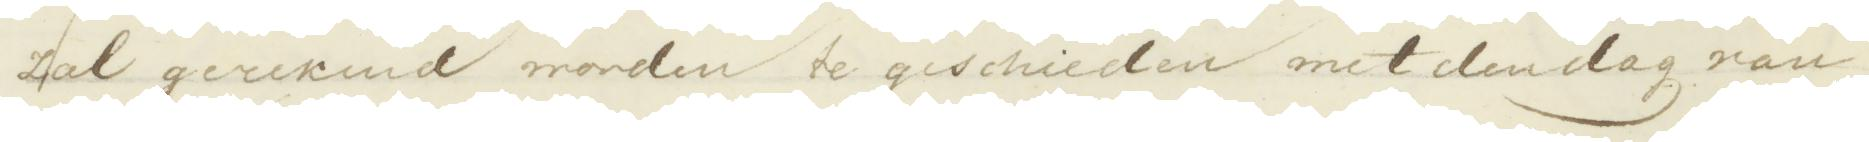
zal gerekend worden te geschieden met den dag van
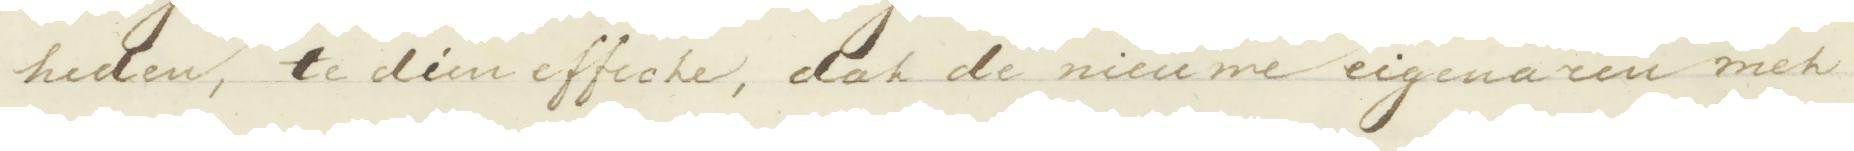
heden, te dien effecte, dat de nieuwe eigenaren met
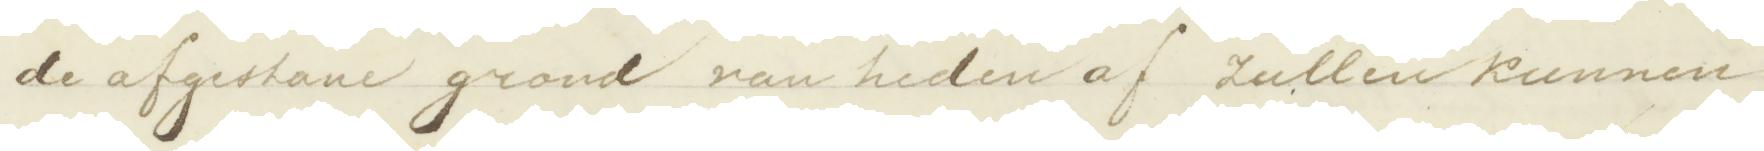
de afgestane grond van heden af zullen kunnen
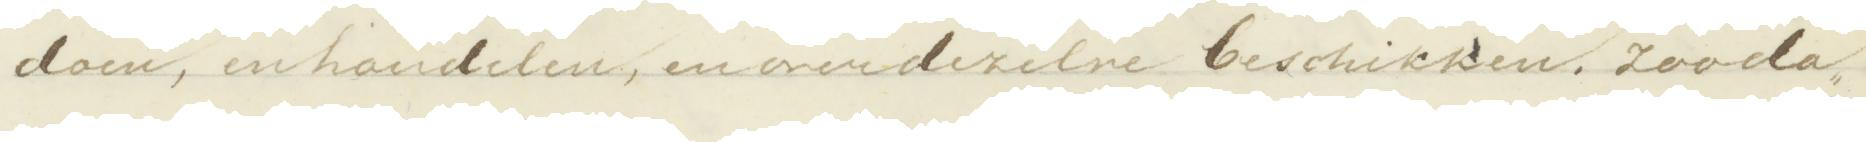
doen, en handelen, en over dezelve beschikken, zooda„
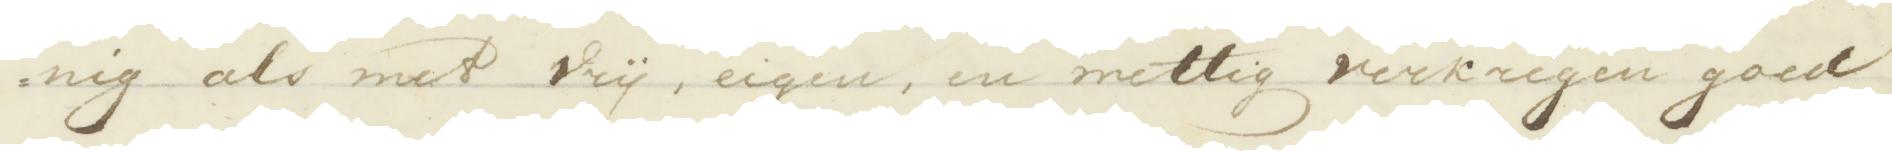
=nig als met vrij, eigen, en wettig verkregen goed
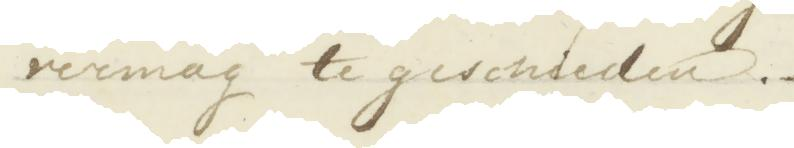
vermag te geschieden.
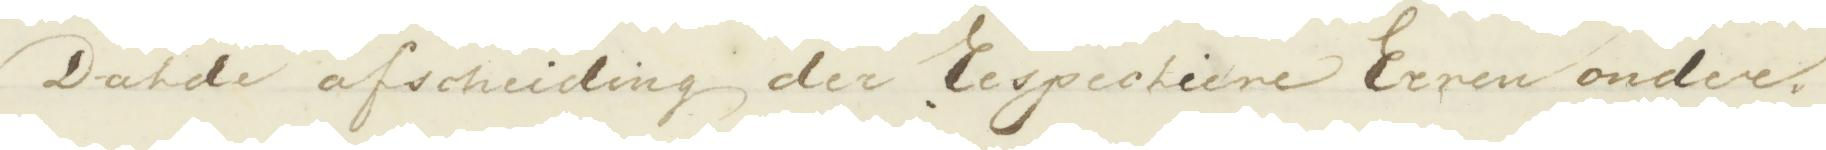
Dat de afscheiding der Respectieve Erven onder„
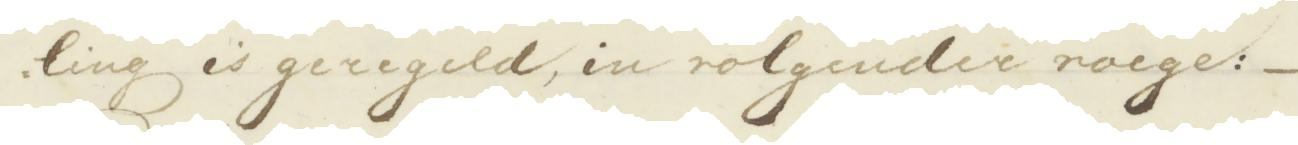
=ling is geregeld, in volgender voege:-
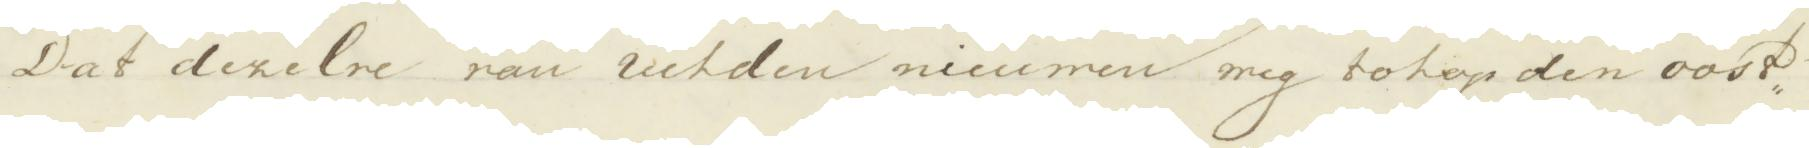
Dat dezelve van uitden nieuwen weg tot op den oost„
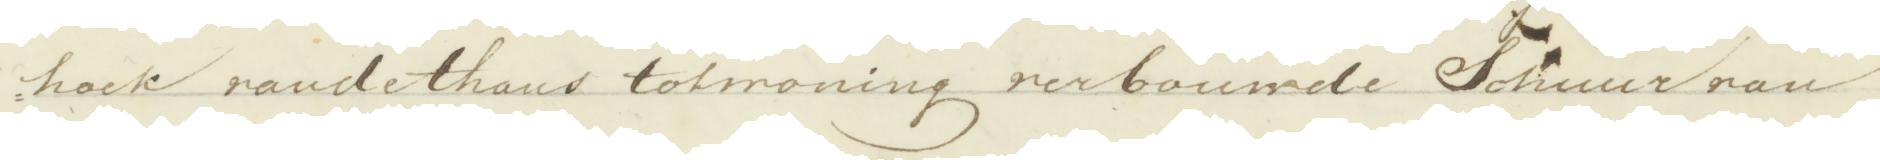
=hoek van de thans totwoning verbouwde Schuur van
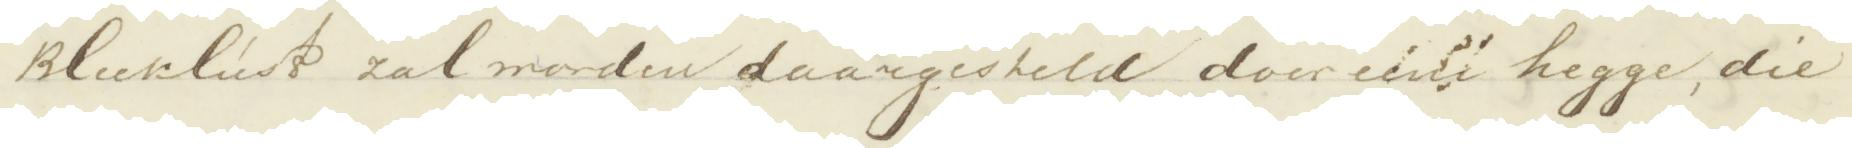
Bleeklust zal worden daargesteld door eene hegge, die
